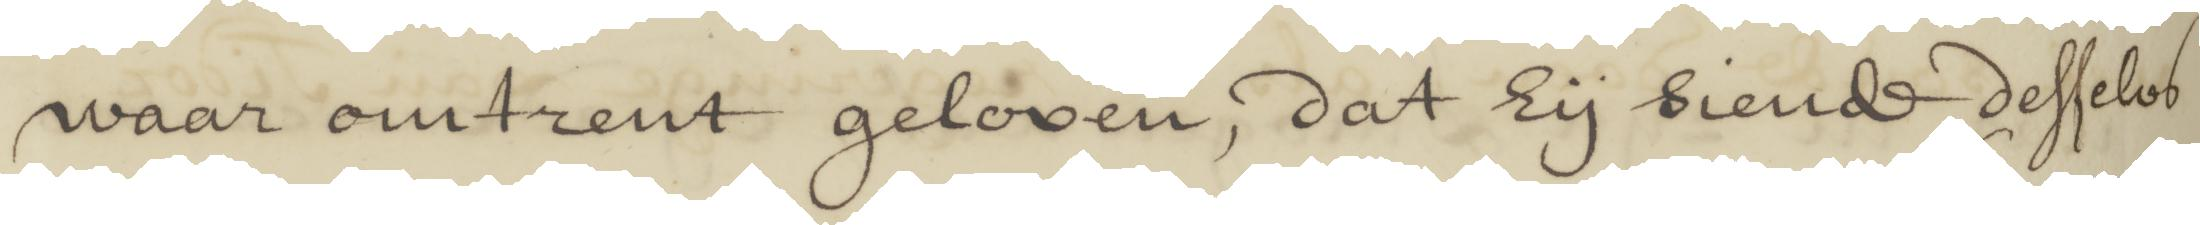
waar omtrent geloven, dat hij siende desselvs
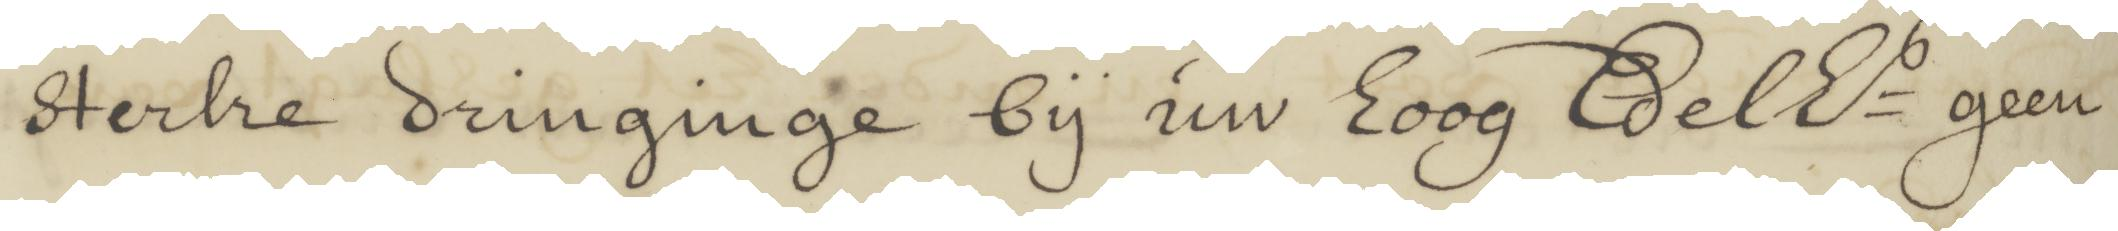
sterke dringinge bij uw hoog Edelh=s geen
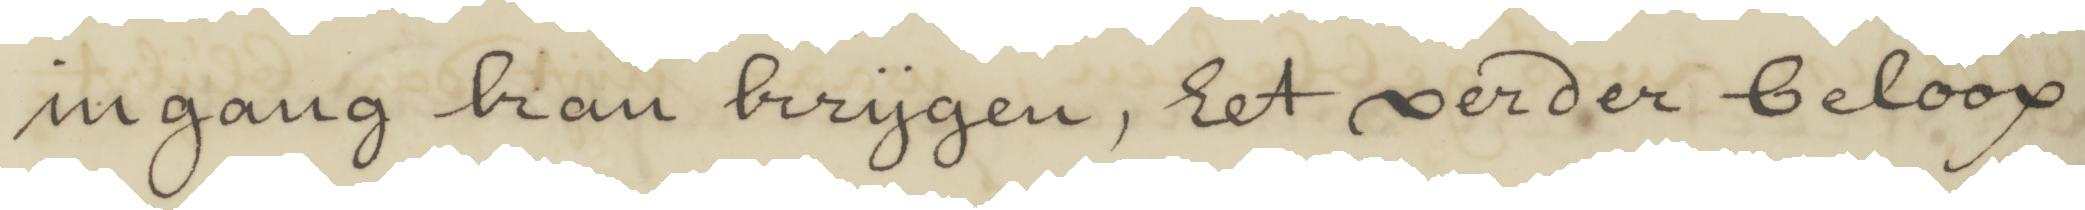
ingang kan krijgen, het verder beloop
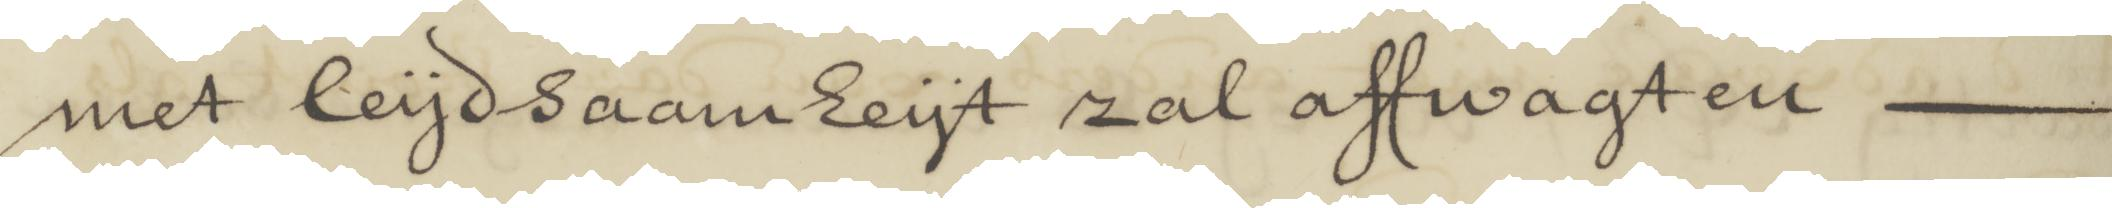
met leijdsaamheijt zal affwagten —
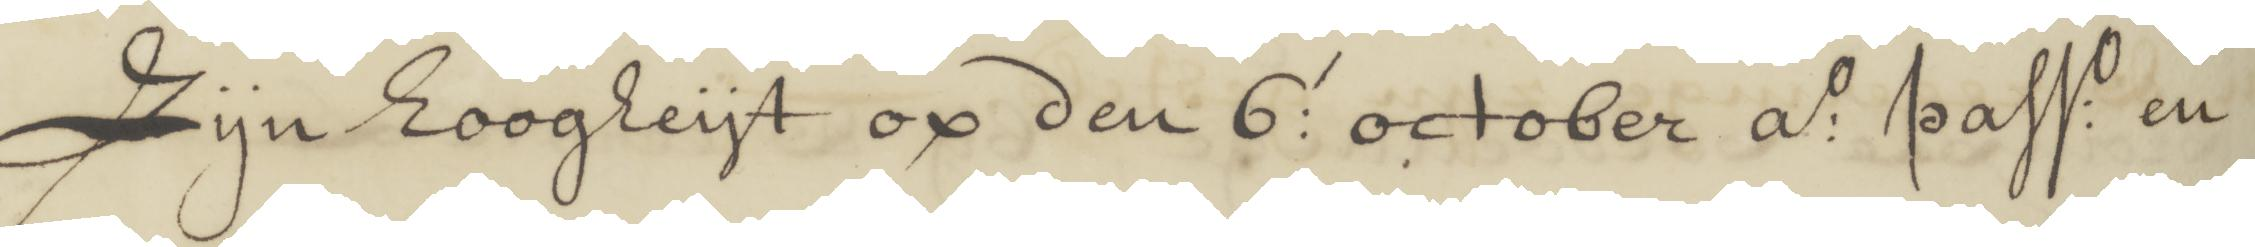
Zijn hoogheijt op den 6:' october a:o pass:o en
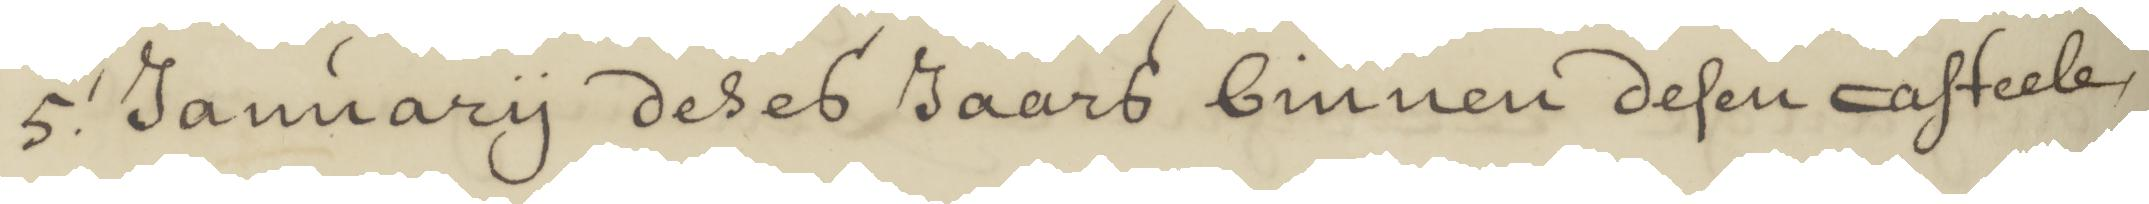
5.' Ianuarij deses Iaars binnen desen casteele,
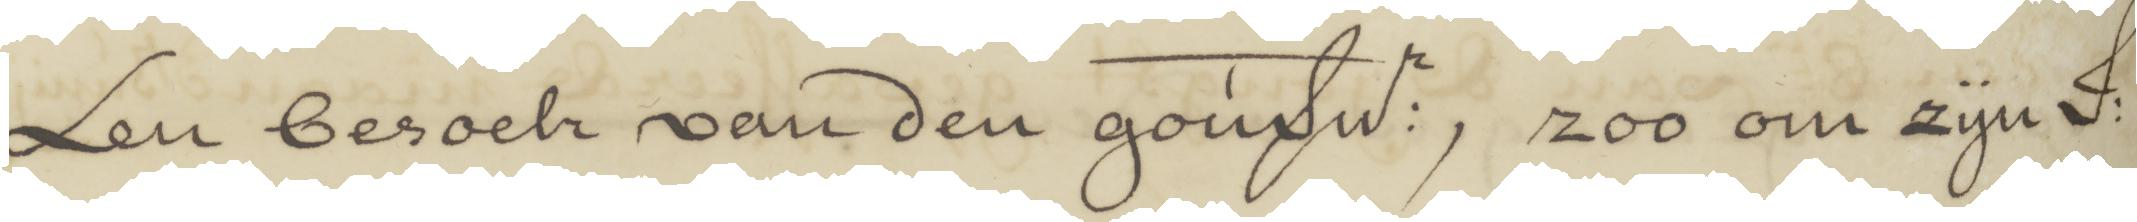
ten besoek van den gouvern:r, zoo om zijn E:
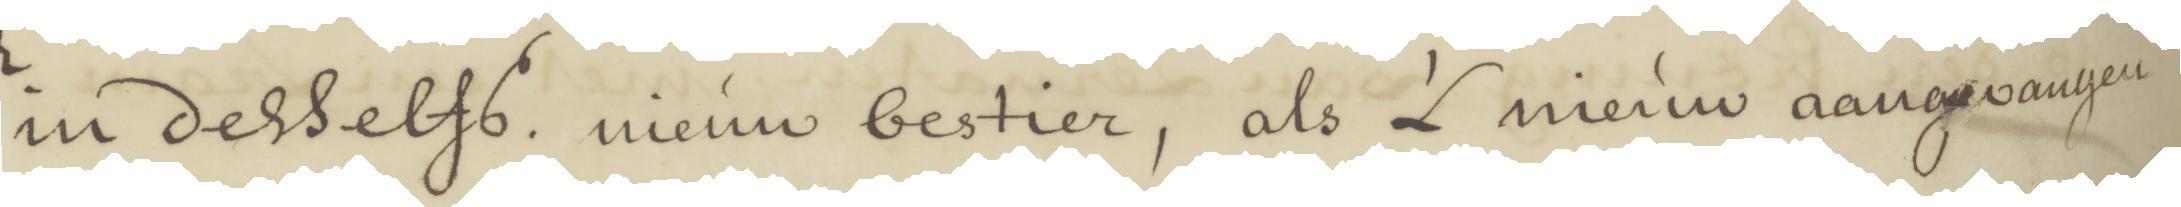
in desselfs.s nieuw bestier, als 't nieuw aangevangen
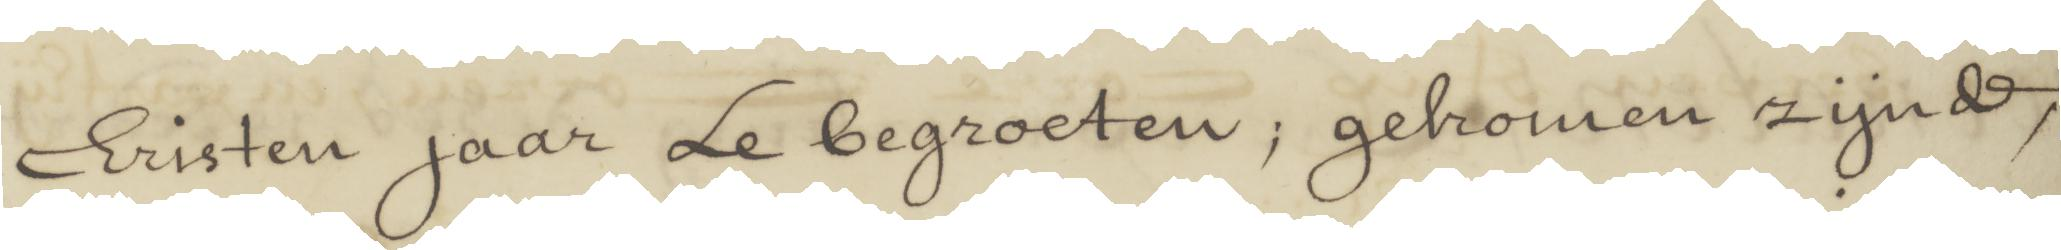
christen jaar te begroeten; gekomen zijnde,
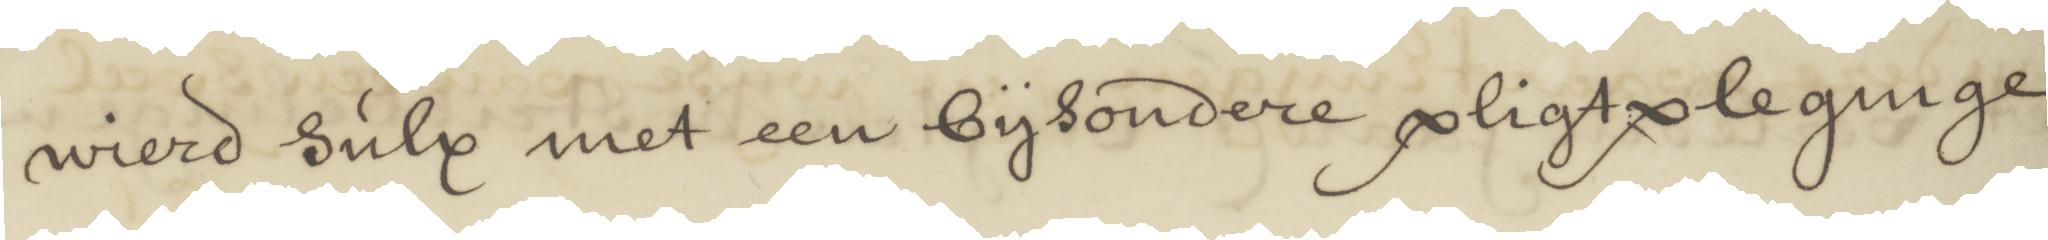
wierd sulx met een bijsondere pligtpleginge
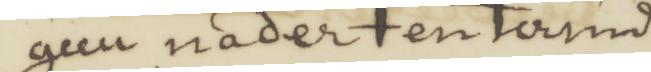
geen nader tentamen
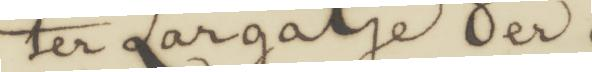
ter Largatje der
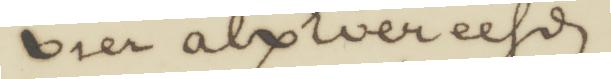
vier alphoereesen
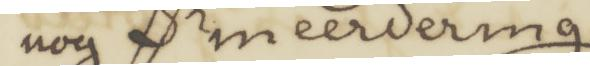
nog vermeerdering
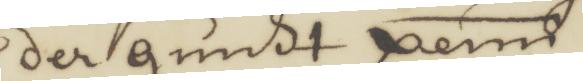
der gunst penn
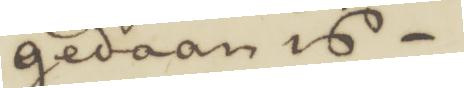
gedaan is -
